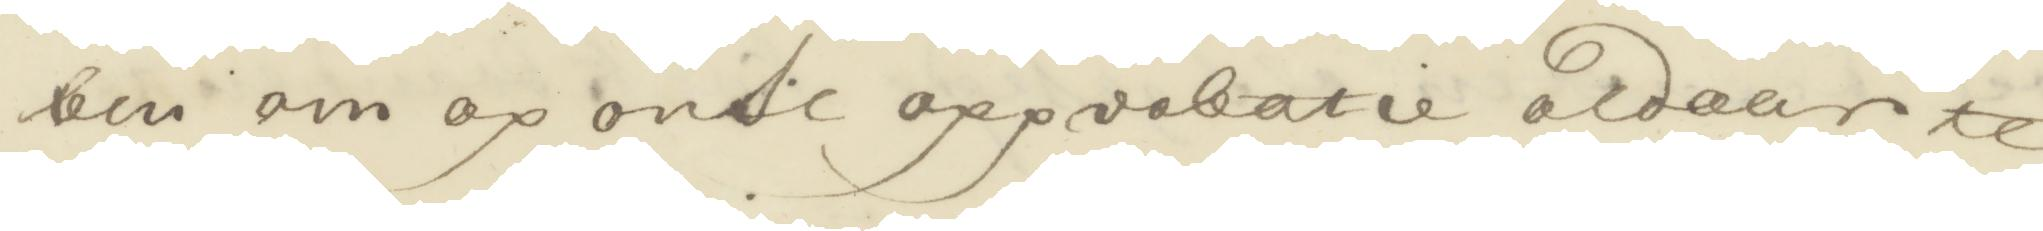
ben om op onse approbatie aldaar te
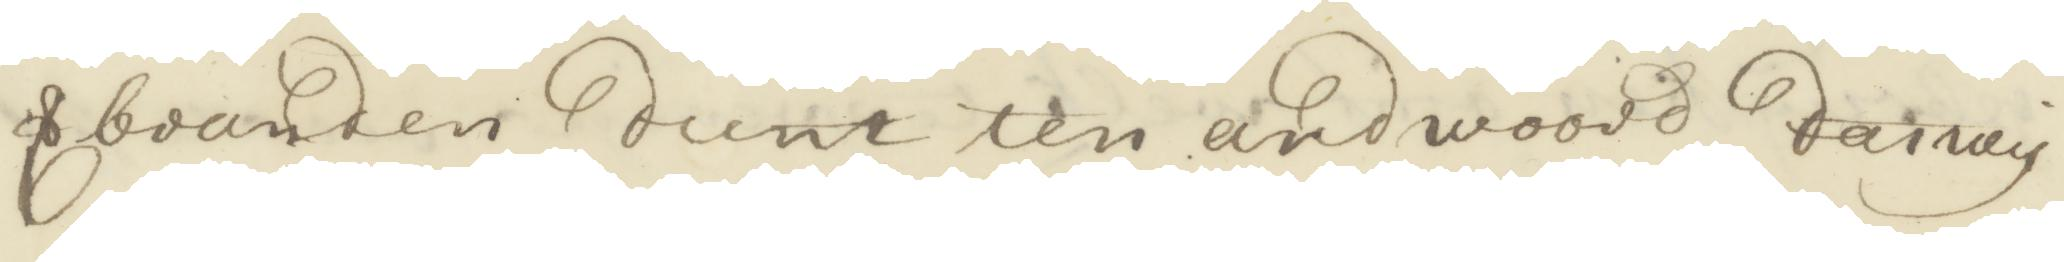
verbranden dient ten andwoord dat wij
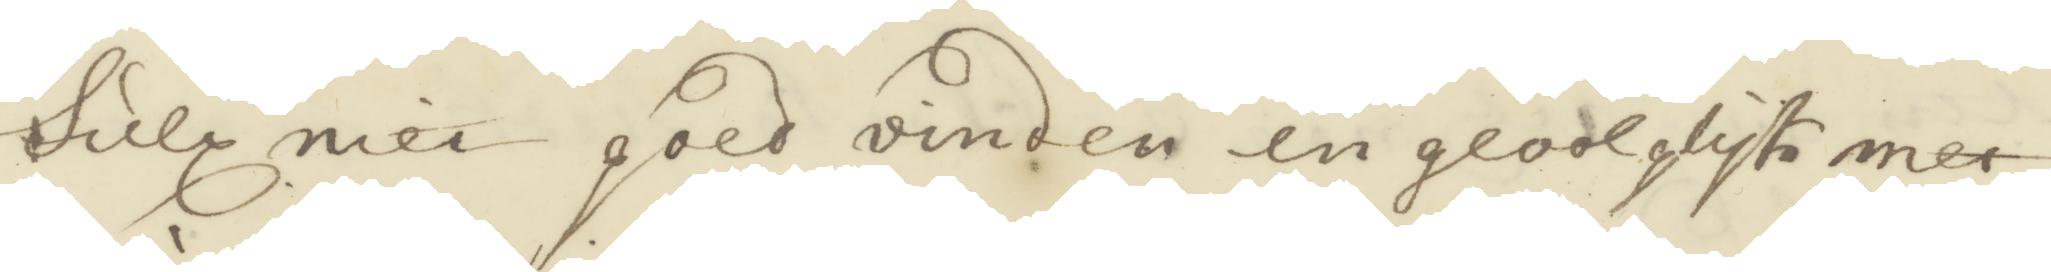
sulx niet goed vinden en gevolglijk met
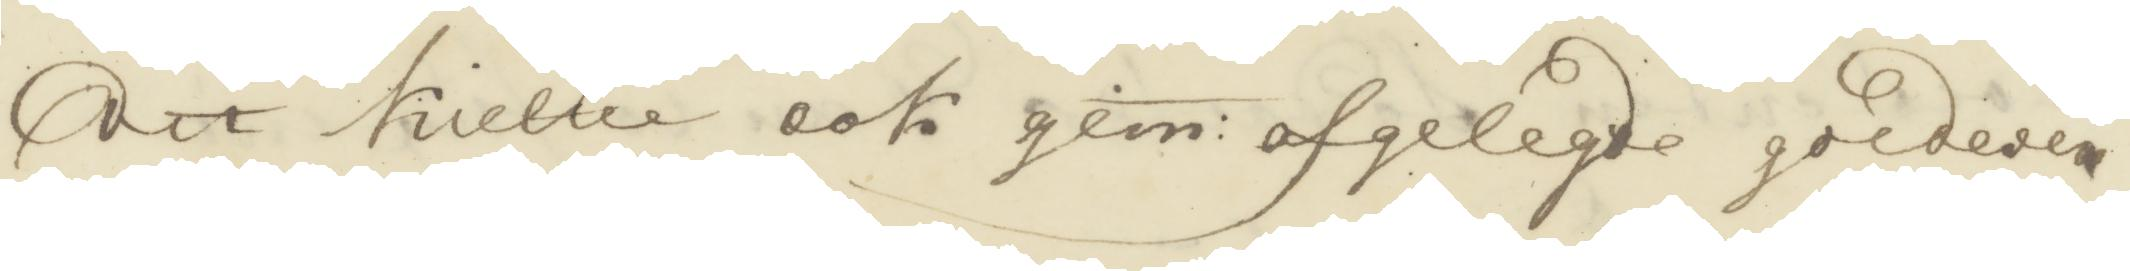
dit kieltie ook gem: afgelegde goederen
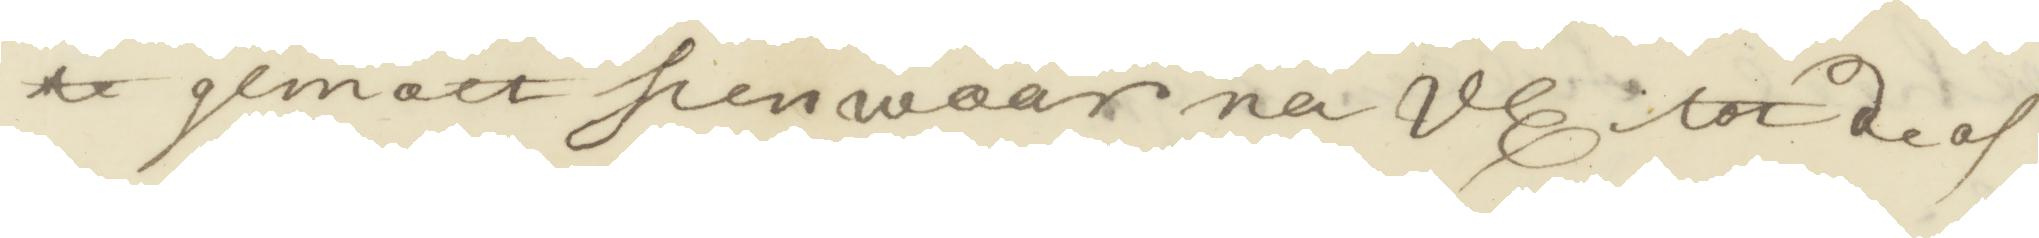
te gemoet sien waar na UE: tot de af
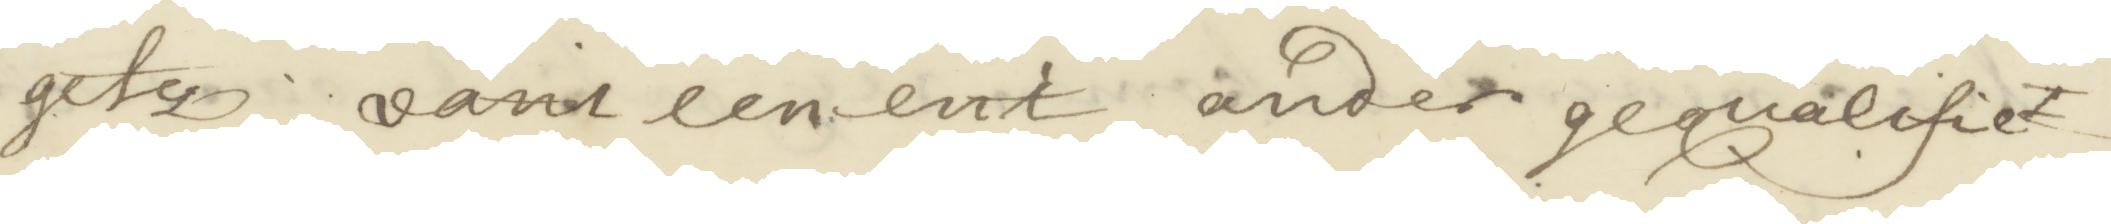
gesz: van’t een ent ander gequalifiet
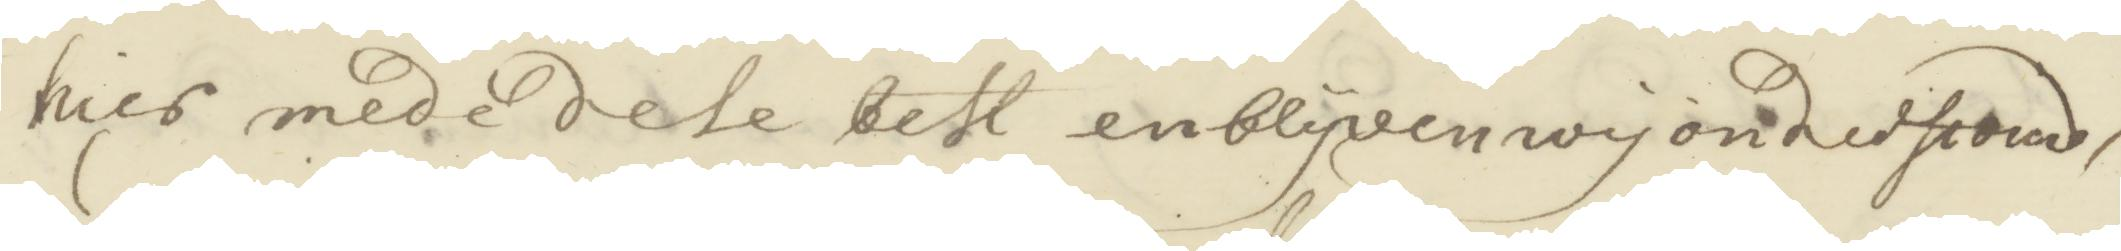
hier mede dese besl en blijven wij onderstond/
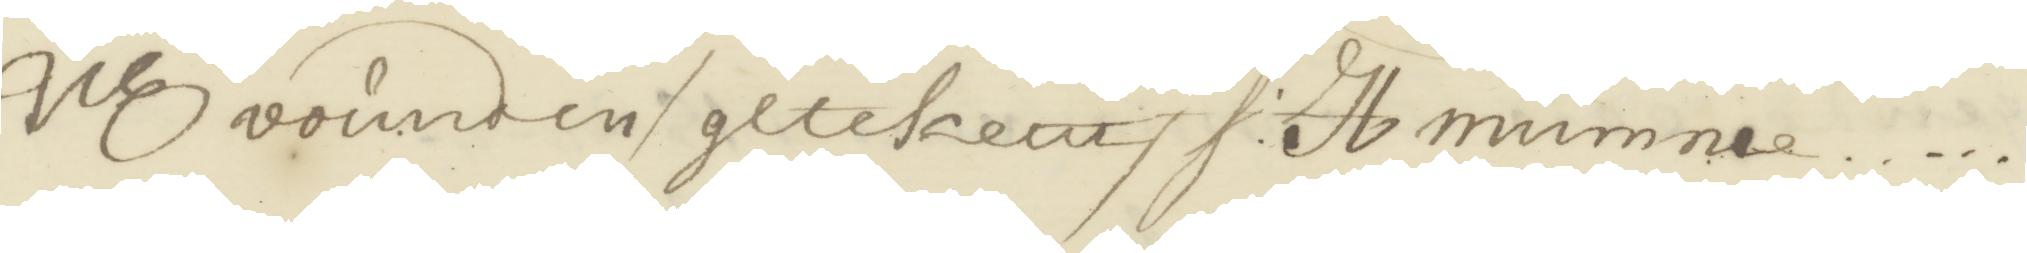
UE vrunden getekent/ F:H mummee. . . . .
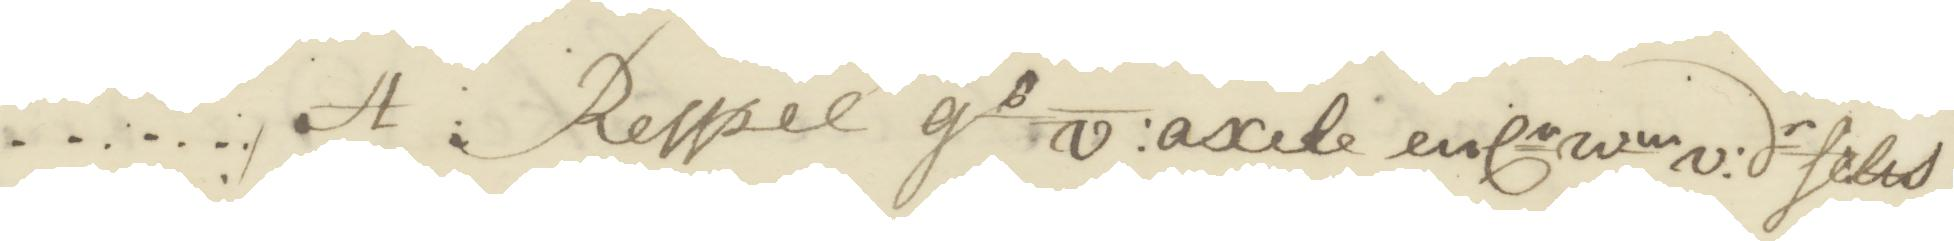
. . . . . .A: Reppel g-s v: axele en C=n w-m v:d=r felts
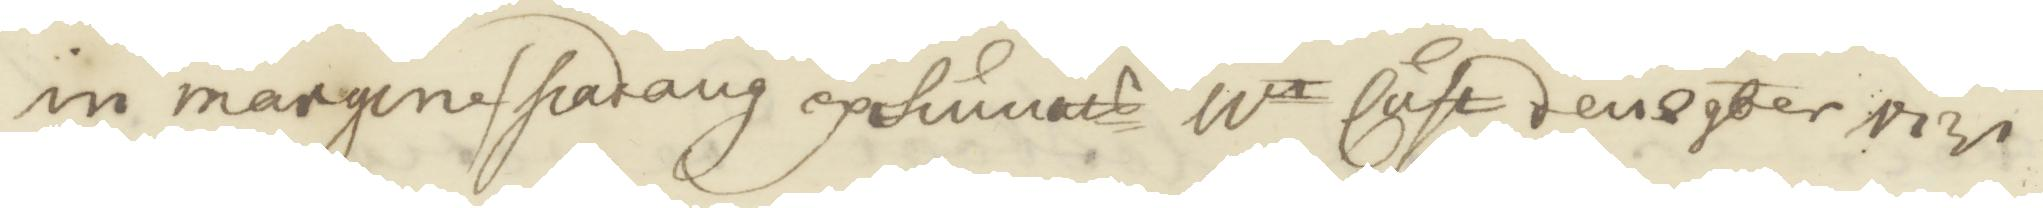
in margine/ padang opsumat=s W-t Cust den 8 xber 1731
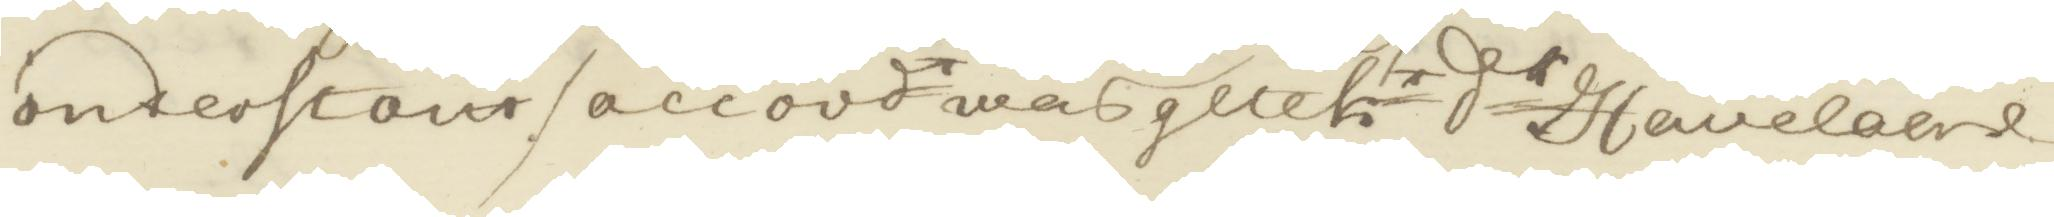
onderstont / accord=t was getekt=t d=k Havelaere
